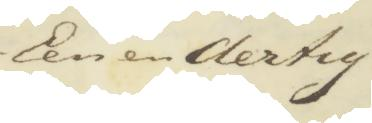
Een en dertig
